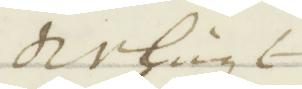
Nvlugt
